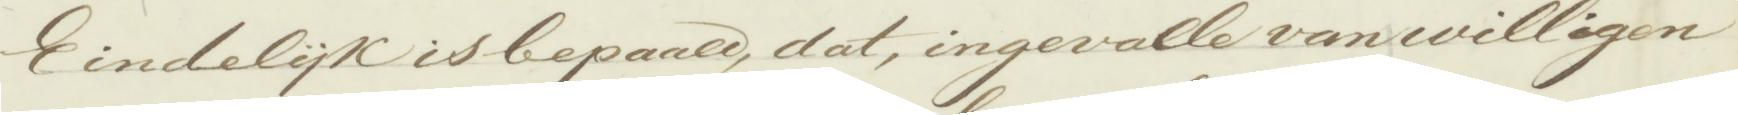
Eindelijk is bepaald, dat, ingevalle van willigen
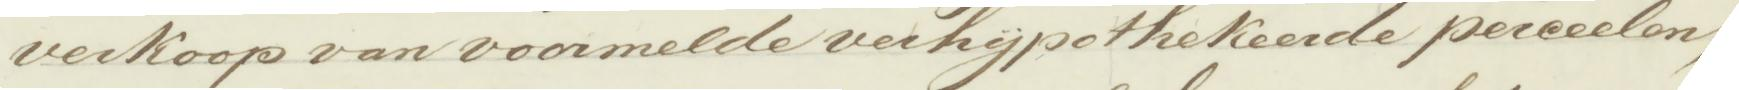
verkoop van voormelde verhijpothekeerde perceelen,
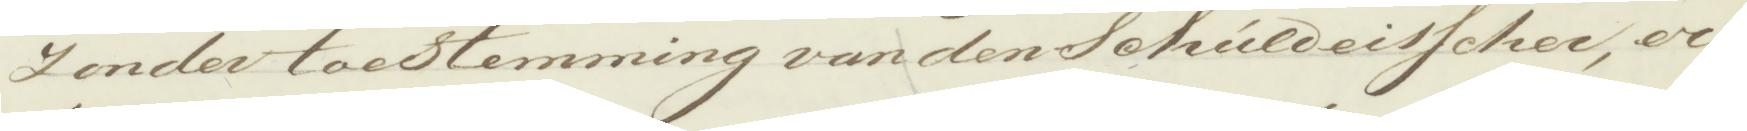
sonder toestemming van den Schuldeisscher, er
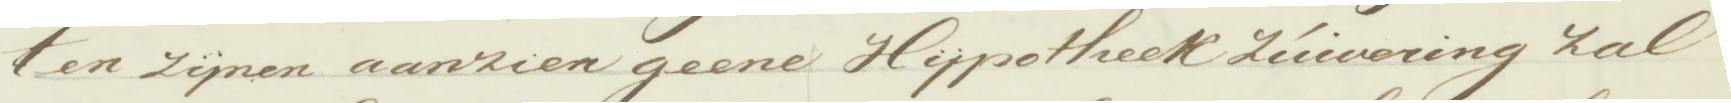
ten zijnen aanzien geene Hijpotheek zuivering zal
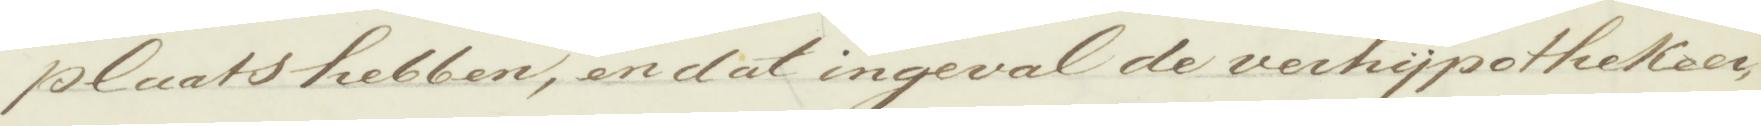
plaats hebben, en dat ingeval de verhijpothekeer,
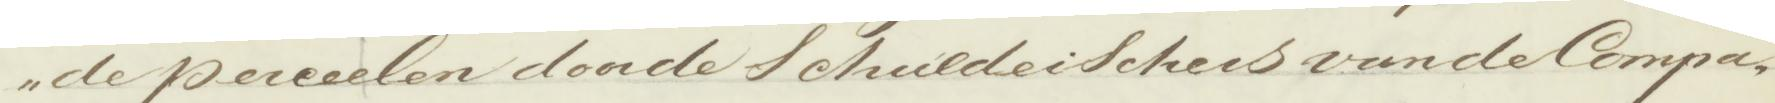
„de perceelen door de Schuldeischeis van de Compa„
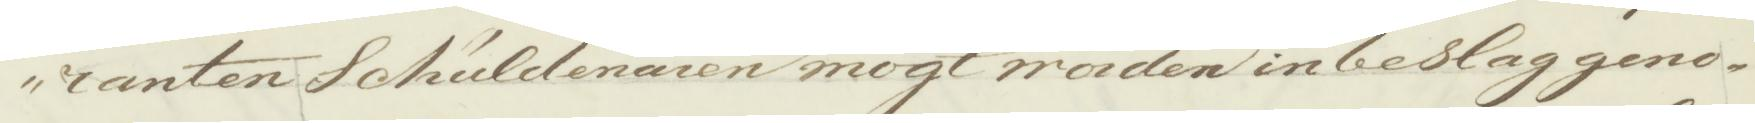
„ranten schuldenaren mogt worden in beslag geno„
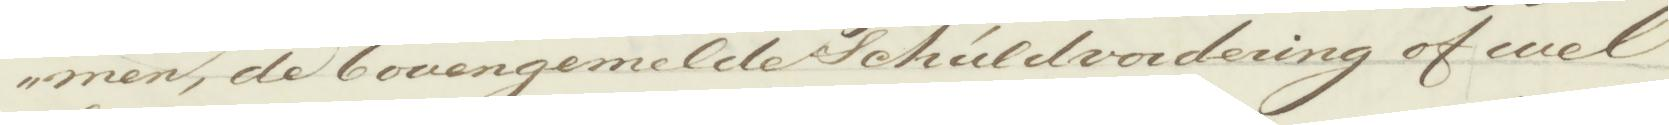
„men, de bovengemelde schuldvordering of wel
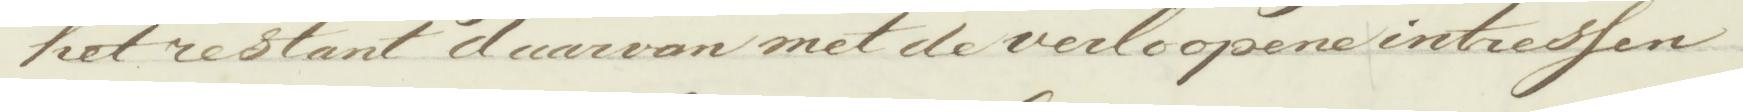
het restant daarvan met de verloopene intressen
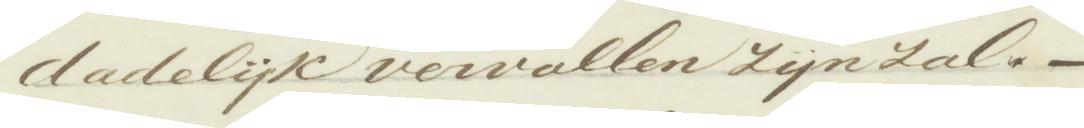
dadelijk vervallen zijn zal„-
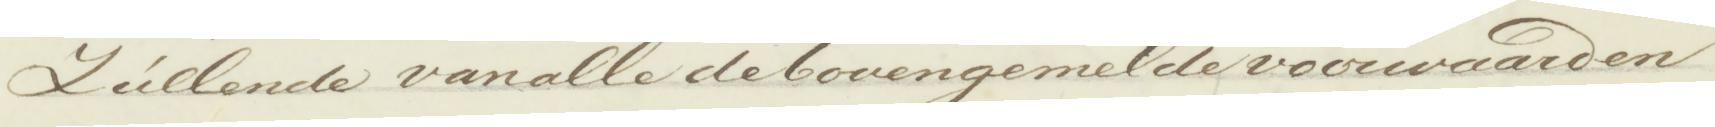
Zullende van alle de bovengemelde voorwaarden
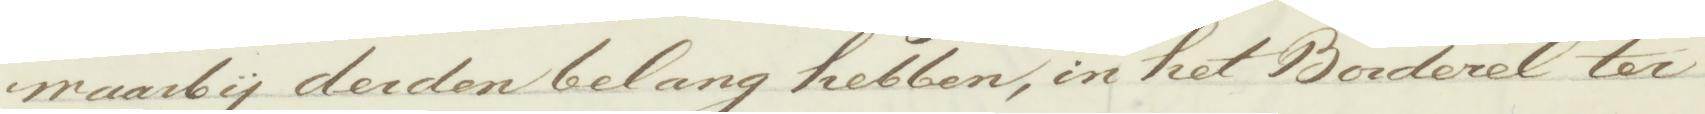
waarbij derden belang hebben, in het Borderel ter
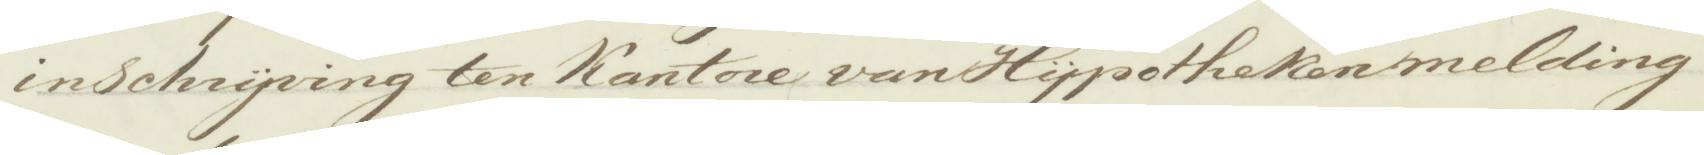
inschrijving ten Kantore van Hijpotheken melding
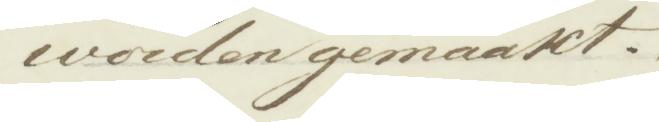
worden gemaakt.
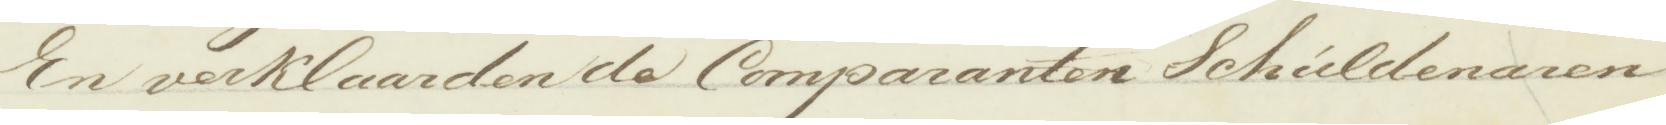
En verklaarden de Comparanten schuldenaren
